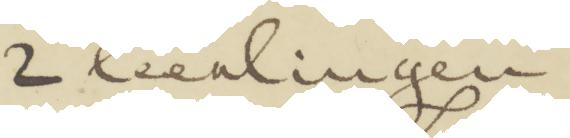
2 leerlingen
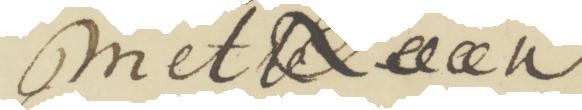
metselaar
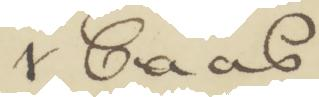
1 baas
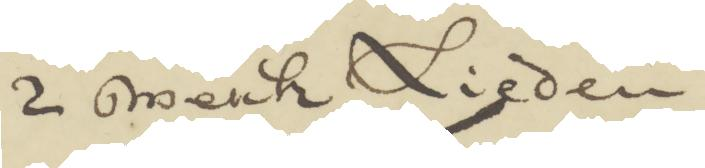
2 werk Lieden
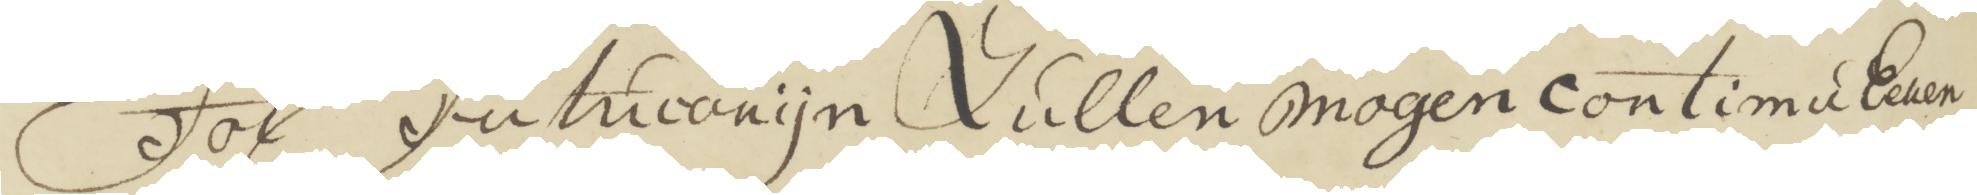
Tot Tutucorijn zullen mogen contimu Eeren
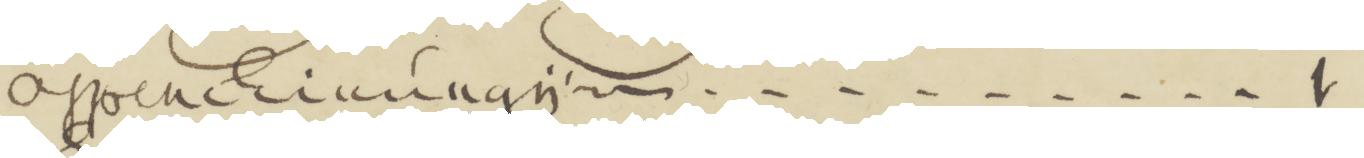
opperchirurgijn - - - - - - - - - 1
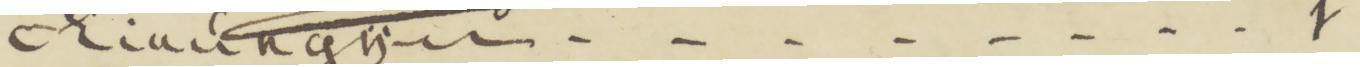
chirurgijn - - - - - - - - 1
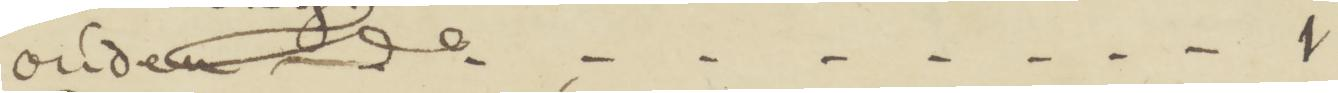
ouder do - - - - - - - - 1
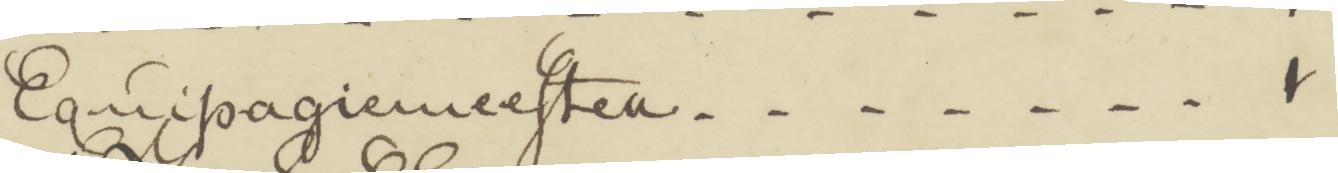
Equipagiemeester - - - - - - - 1
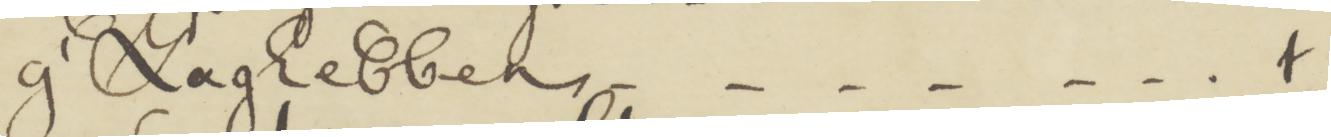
g' Zaghebber - - - - - - - 1
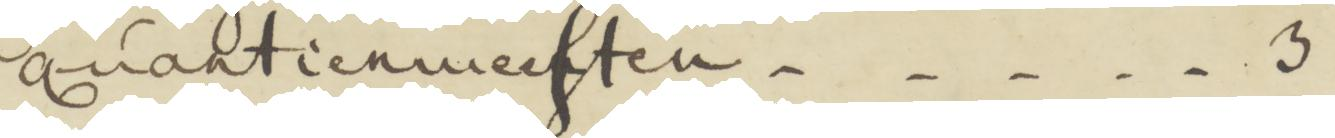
quartiermeester - - - - - 3
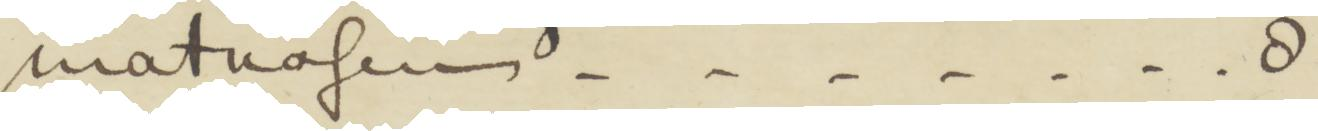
matrosen - - - - - - - 8
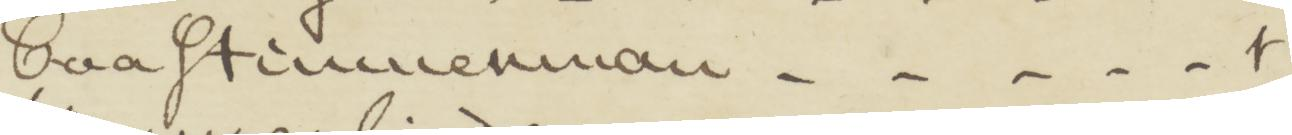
baastimmerman - - - - - 1
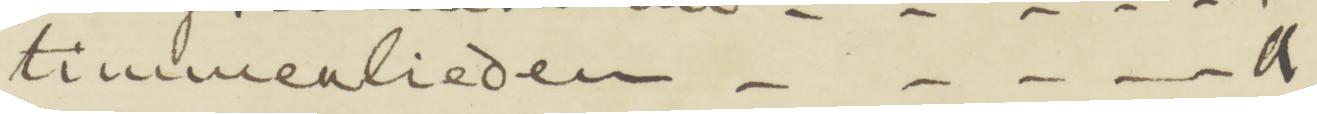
timmerlieden - - - - - 4
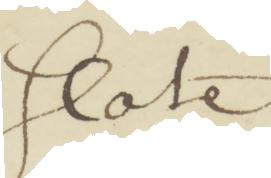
slote
